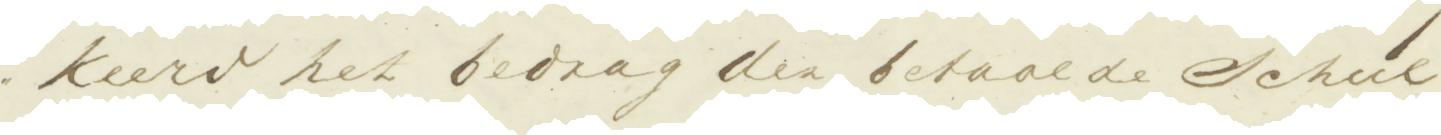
keerd het bedrag der betaalde schul
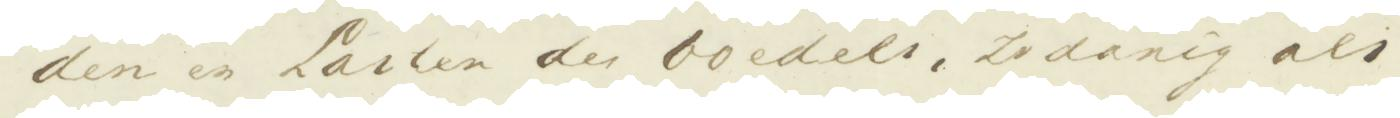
den en Lasten des boedels, zodanig als
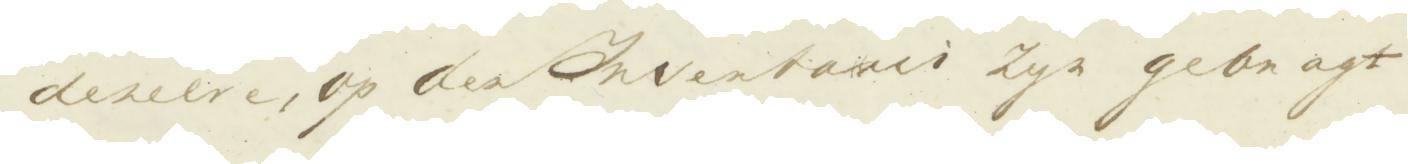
dezelve, op den Inventaris zyn gebragt
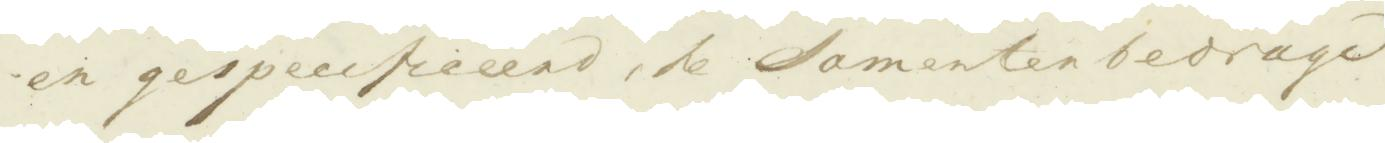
en gespecificeerd, te samen ten bedrage
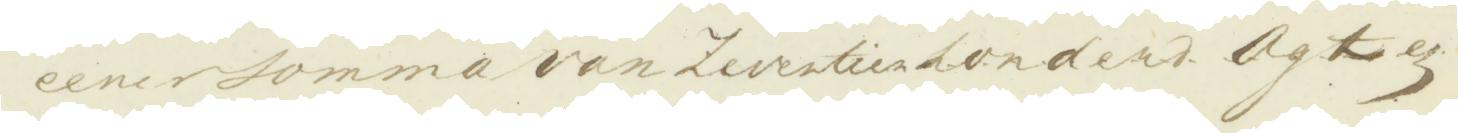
eener somma van Zeventien honderd agt en
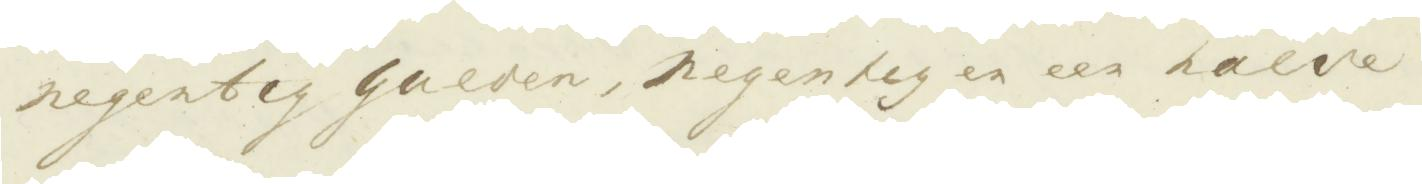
negentig gulden, negentig en een halve
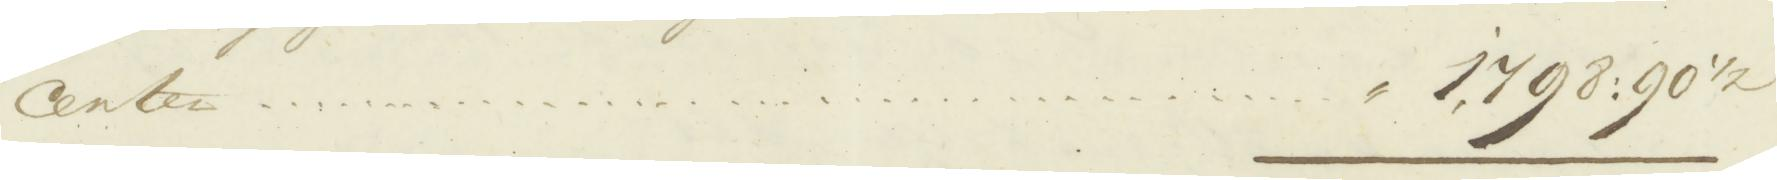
centen . . . . . . . . . . . . . . . . . „ 1,798:90½
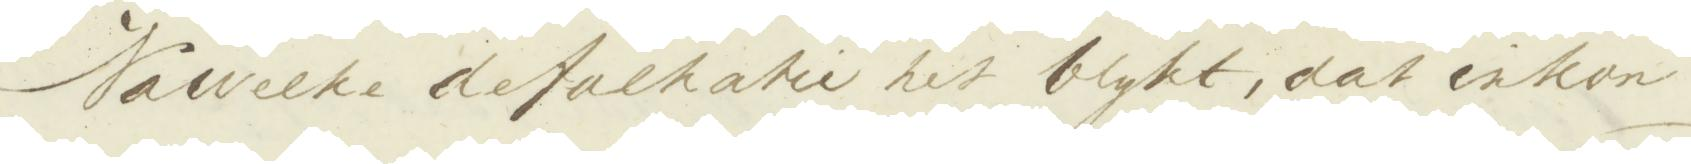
Na welke defalkatie het blykt, dat in kon
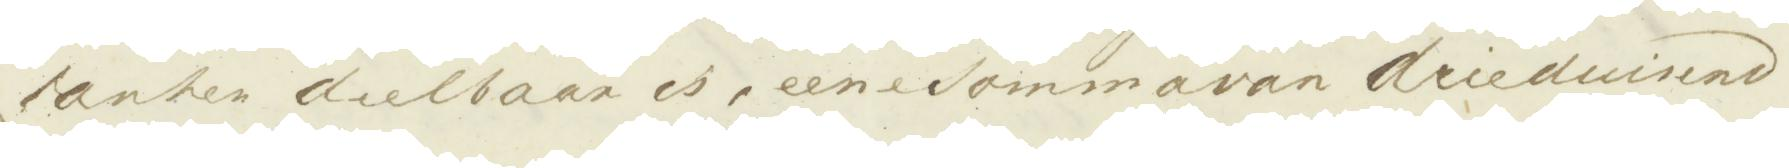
tanten deelbaar is, eene somma van drie duisend
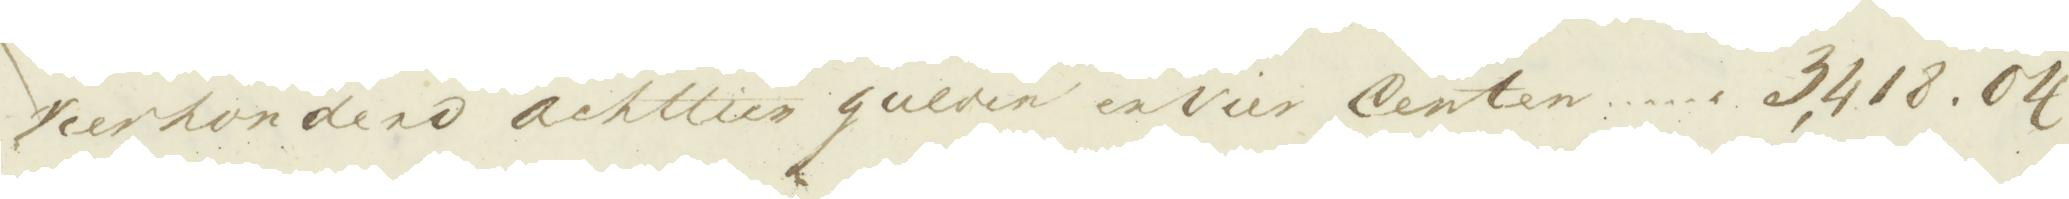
vierhonderd achttien gulden en vier Centen . . . . . „ 3,418.04.
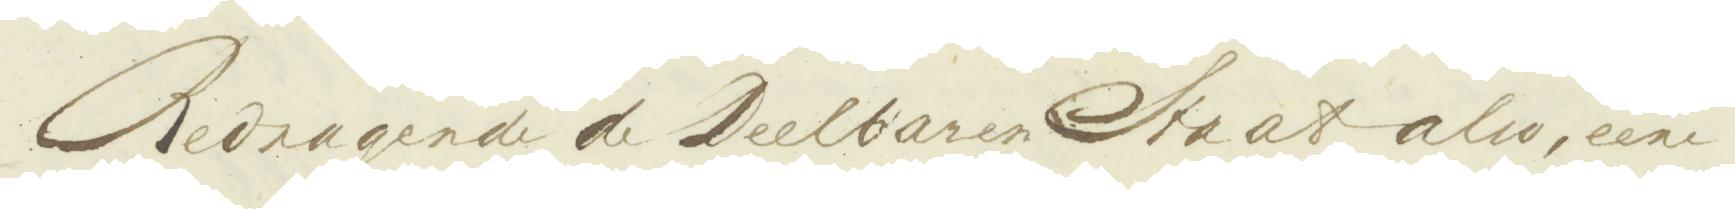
Bedragende de Deelbaren Staat also, eene
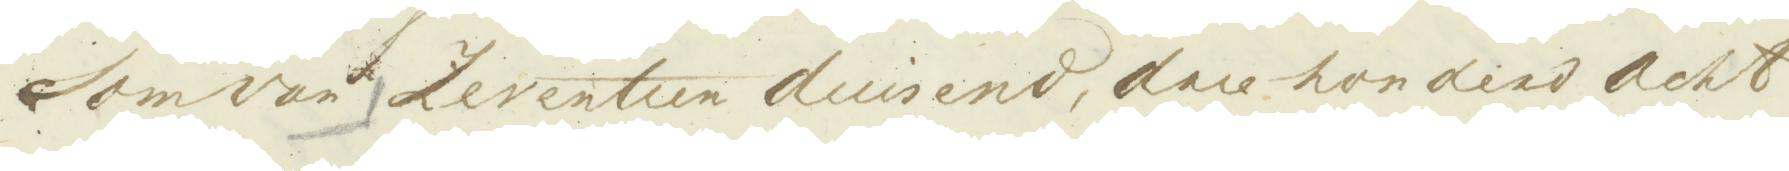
som van Zeventien duisend, drie honderd acht
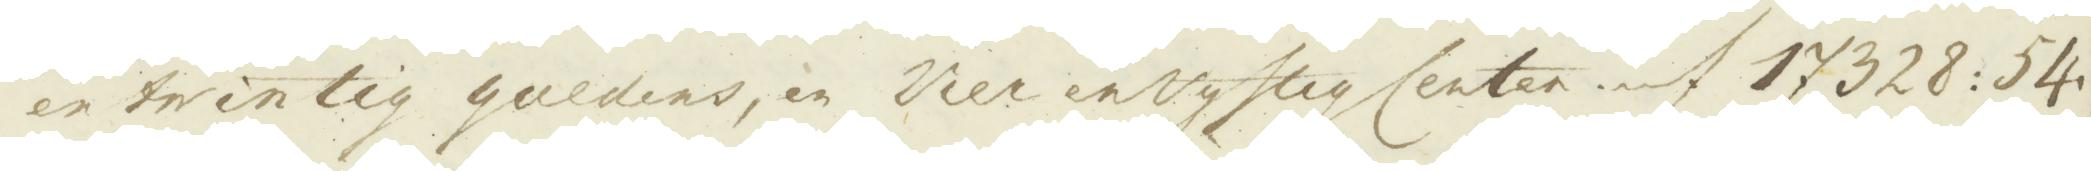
en twintig guldens, en vier en vyftig centen ... ƒ 17,328:54.
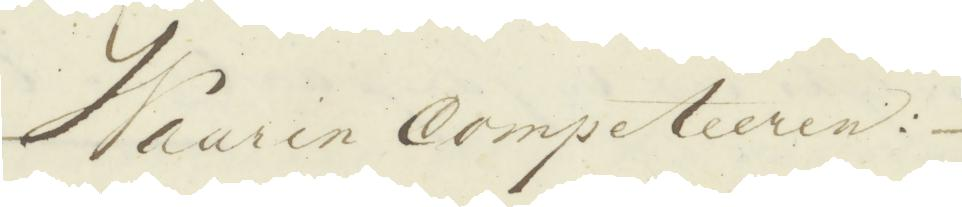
Waarin competeeren:
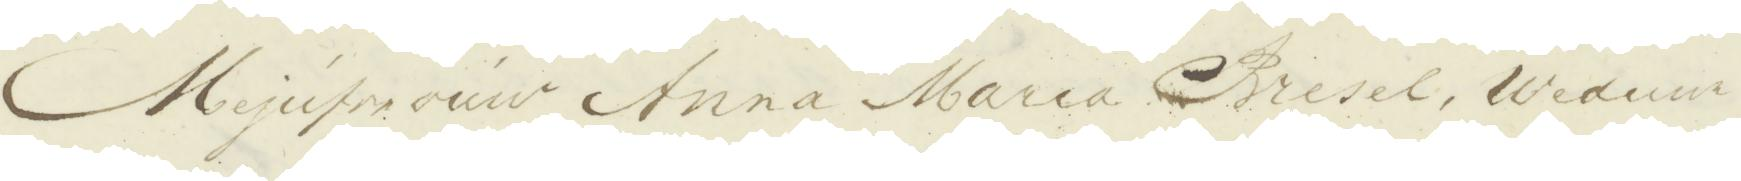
Mejufvrouw Anna Maria Bresel, weduwe
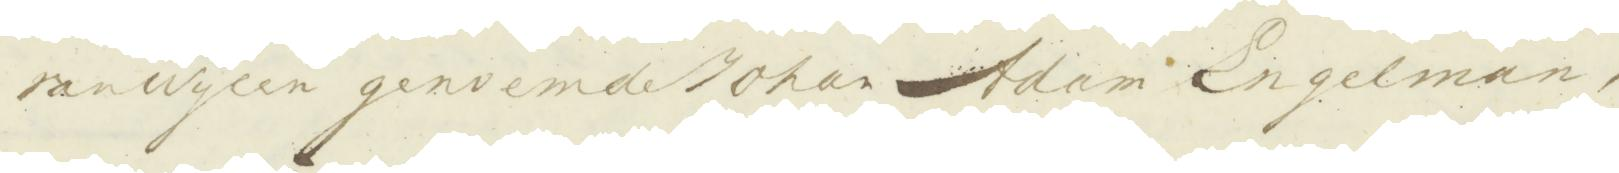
van wylen genoemde Johan Adam Engelman
